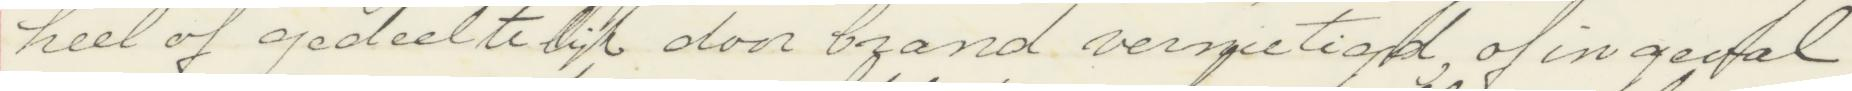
heel of gedeeltelijk door brand vernietigd of in geval
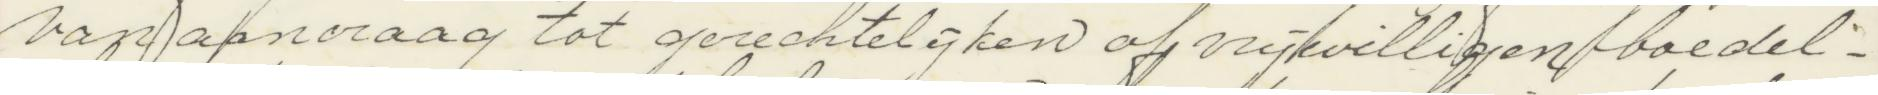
van aanvraag tot gerechtelijken of vrijwilligen boedel-
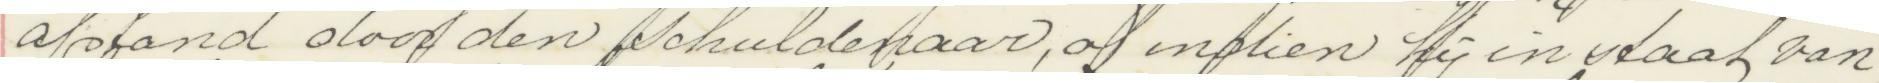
afstand door den schuldeaar, of indien hij in staat van
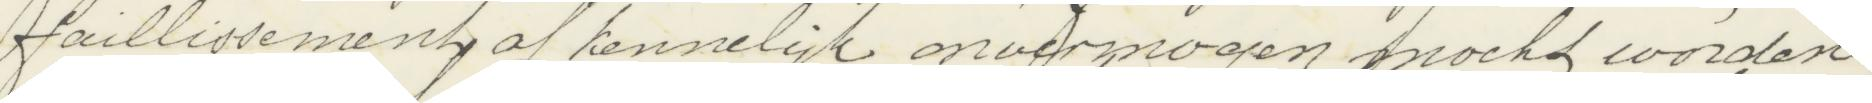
faillissement of kennelijk onvermogen mocht worden
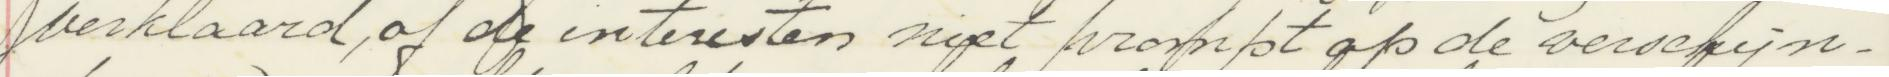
verklaard, of de interesten niet prompt op de verschijn-
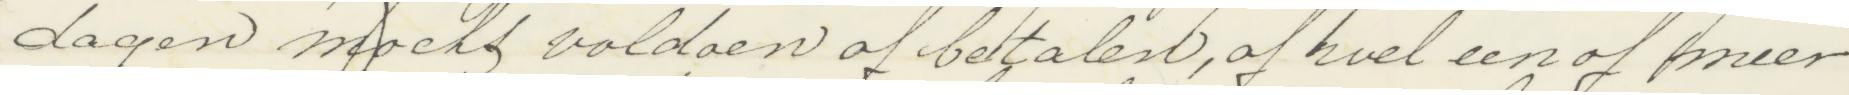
dagen mocht voldoen of betalen, of wel een of meer
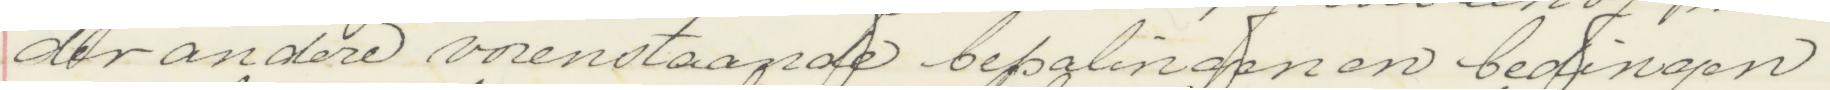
der andere vorenstaande bepalingen en bedingen
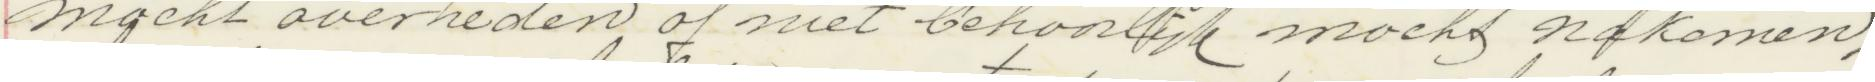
mocht overtreden of niet behoorlijk mocht nakomen,
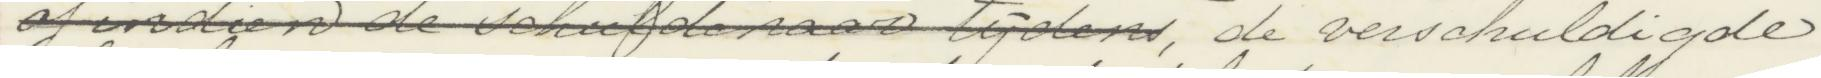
of indien de schuldenaar tijdens, de verschuldigde
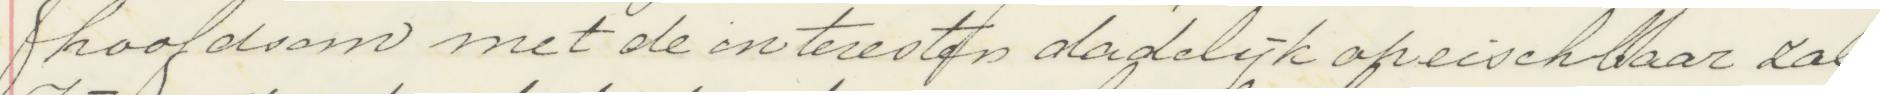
hoofdsom met de interesten dadelijk opeischaar zal
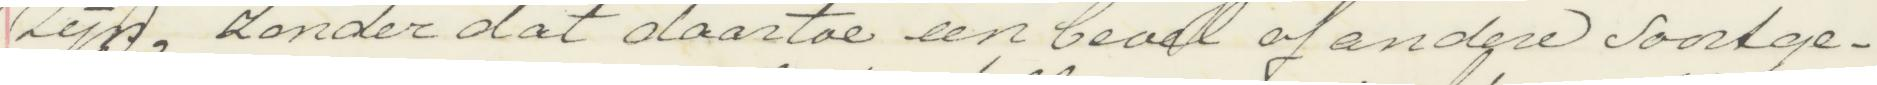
zijn, zonder dat daartoe een bevel of andere soortge-
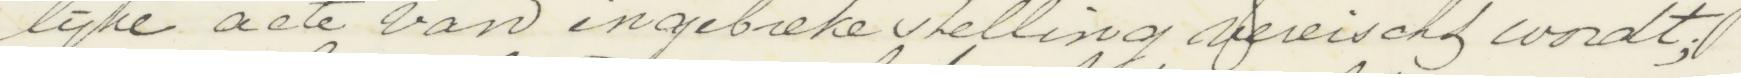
lijke acte van ingebreke stelling vereischt wordt;
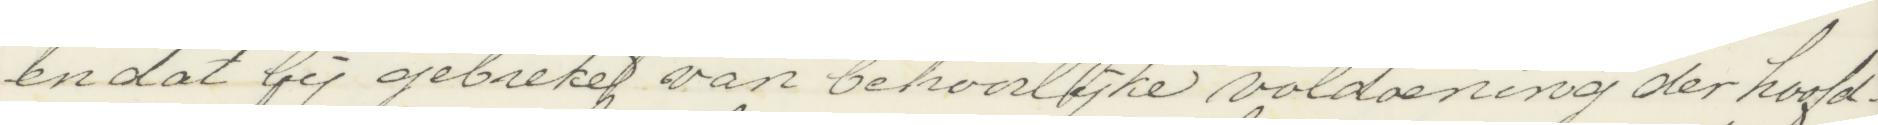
en dat bij gebreke van behoorlijke voldoening der hoofd
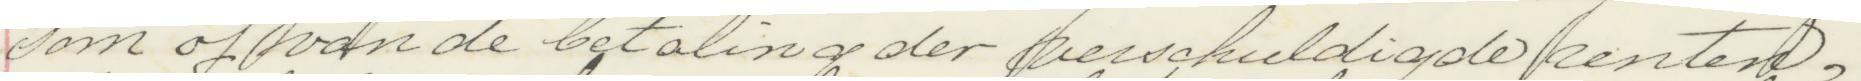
som of van de betaling der verschuldigde renten,
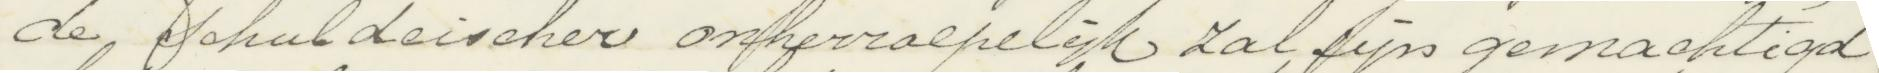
de schuldeischer onherroepelijk zal zijn gemachtigd
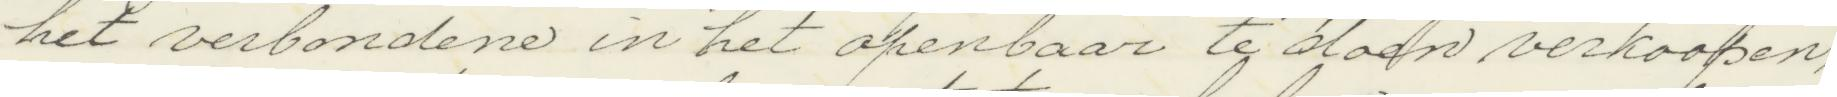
het verbondene in het openbaar te doen verkoopen,
